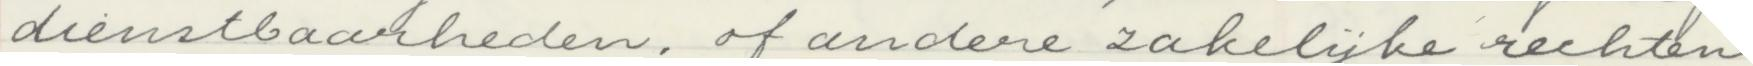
dienstbaarheden, of andere zakelijke rechten
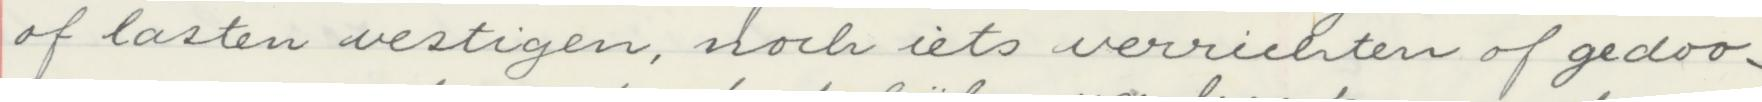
of lasten vestigen, noch iets verrichten of gedoo
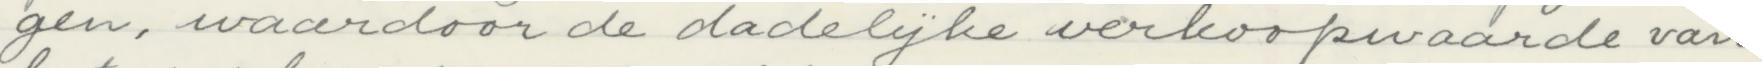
gen, waardoor de dadelijke verkoopwaarde van
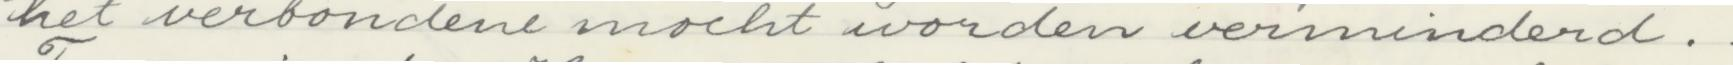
het verbondene mocht worden verminderd.
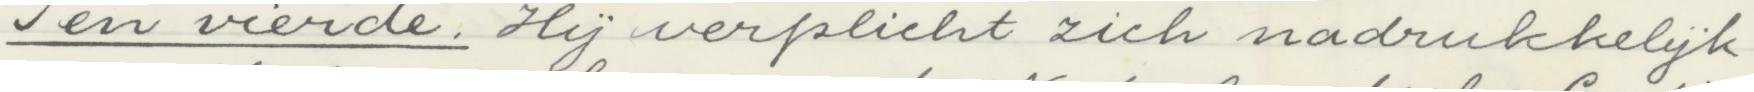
Ten vierde. Hij verplicht zich nadrukkelijk
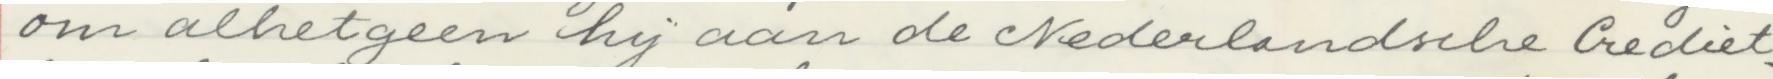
om alhet geen hij aan de Nederlandsche Crediet
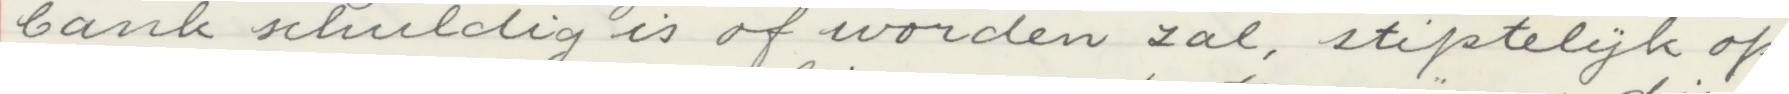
bank schuldig is of worden zal, stiptelijk op
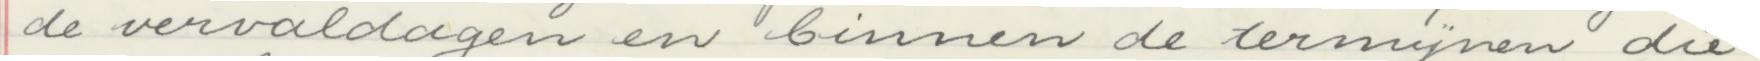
de vervaldagen en binnen de termijnen die
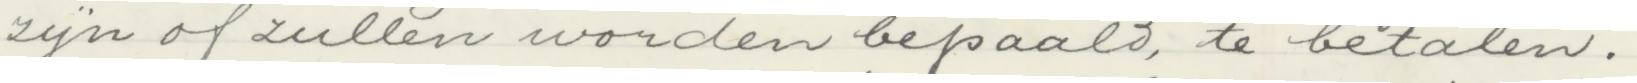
zijn of zullen worden bepaald, te betalen.
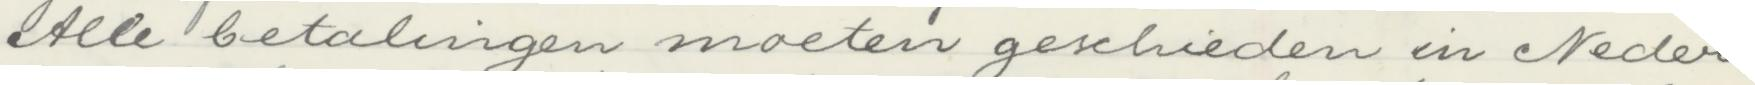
Alle betalingen moeten geschieden in Neder
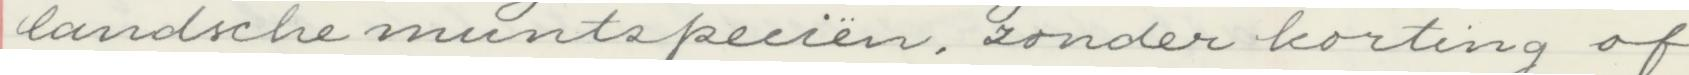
landsche muntspeciën, zonder korting of
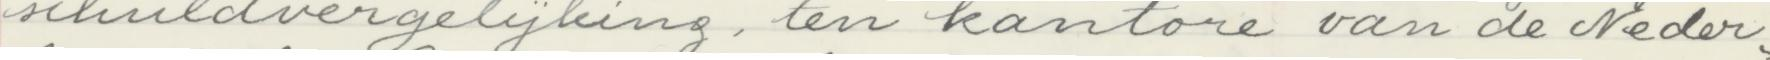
schuldvergelijking, ten kantore van de Neder
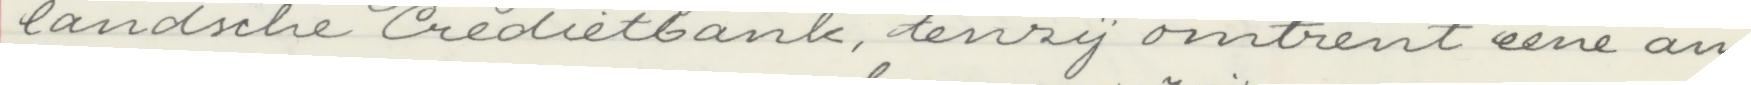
landsche Credietbank, tenzij omtrent eene an
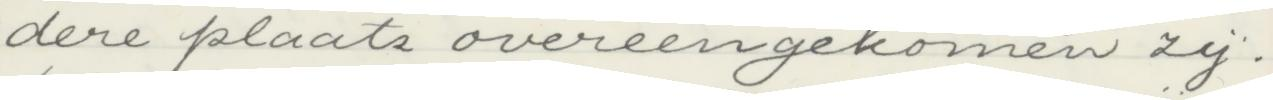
dere plaats overeengekomen zij.
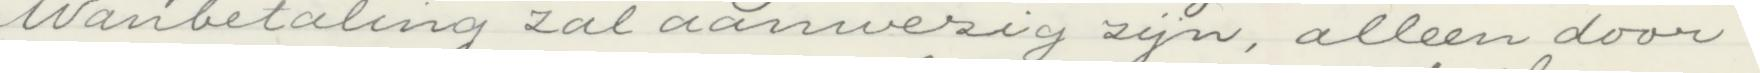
Wanbetaling zal aanwezig zijn, alleen door
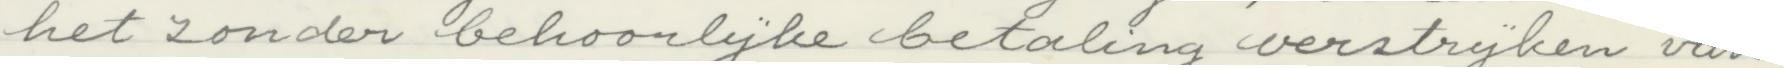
het zonder behoorlijke betaling verstrijken van
